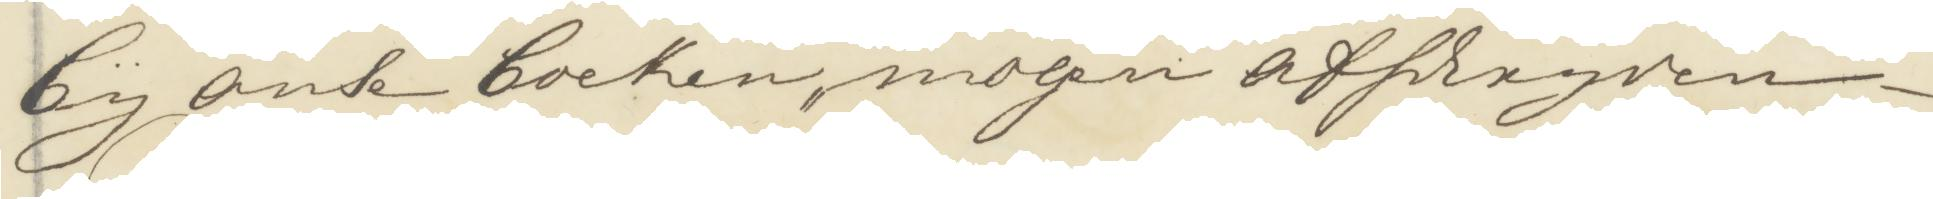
bij onse boeken „ mogen afschrijven —
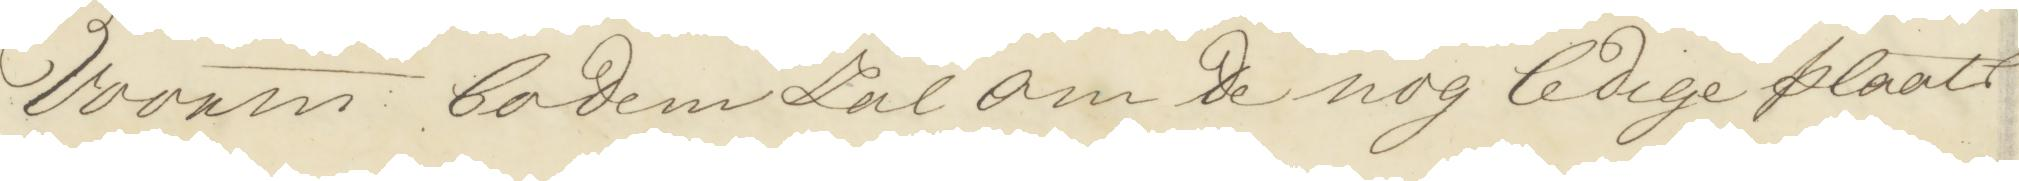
Voorm: bodem zal om de nog ledige plaats
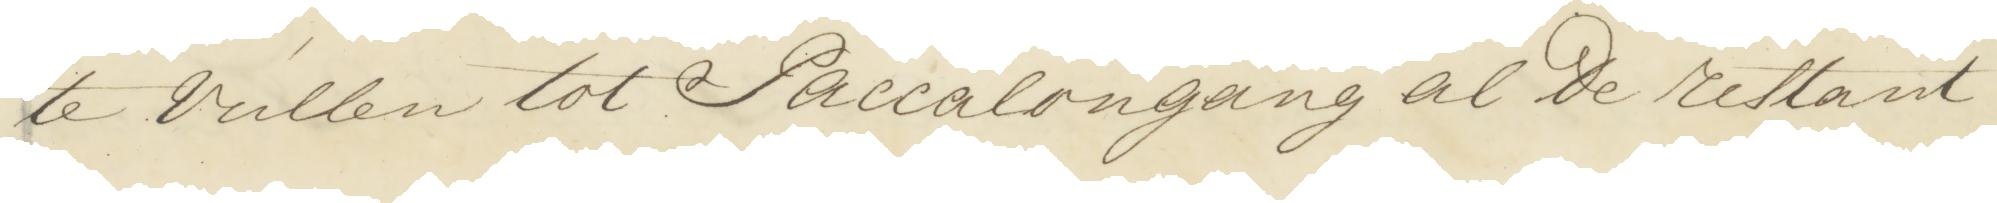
te vullen tot Paccalongang al de restant
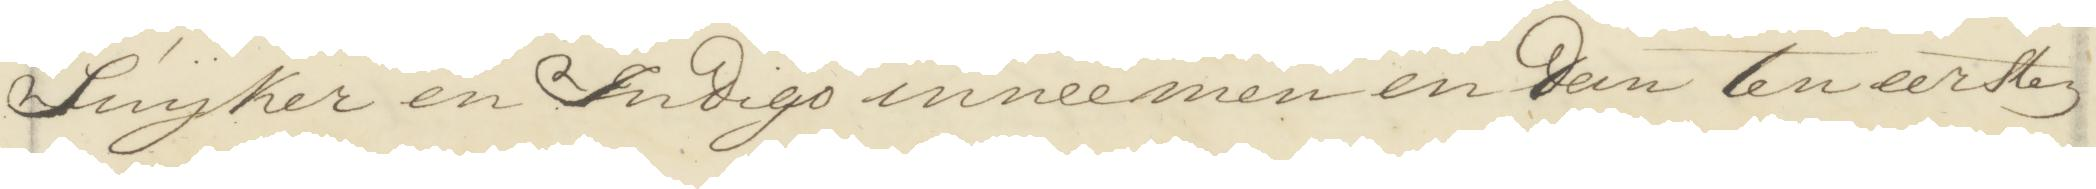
suijker en Jndigo inneemen en dan ten eersten
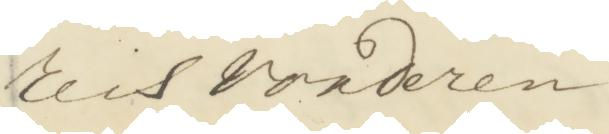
reis vorderen
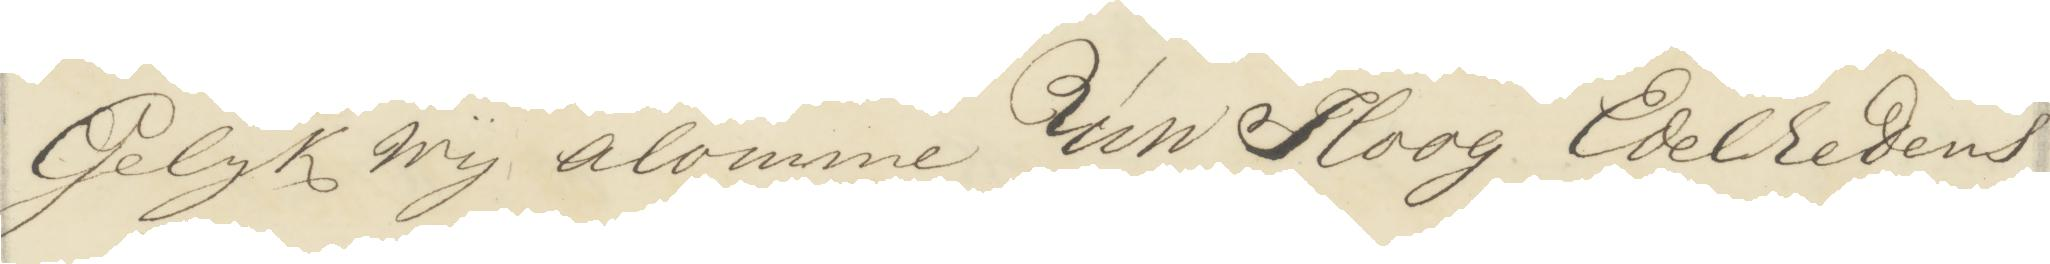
Gelijk wij alomme uw Hoog Edelhedens
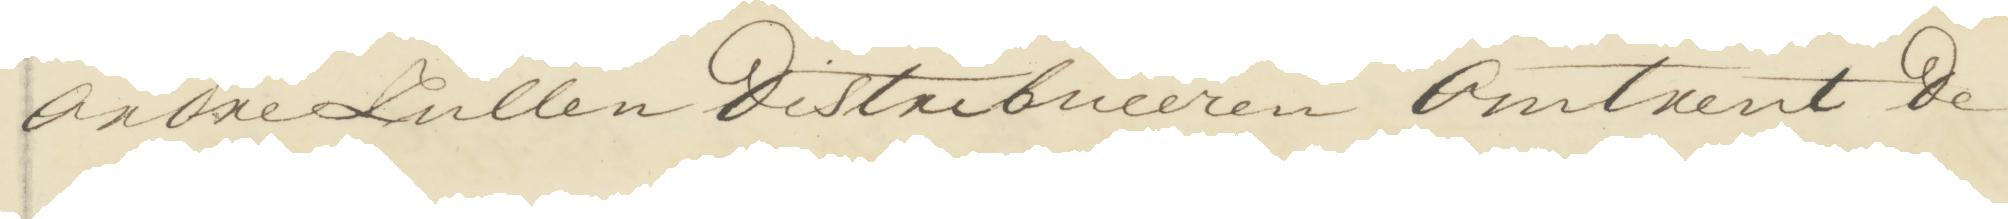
ordre zullen distribueeren omtrent de
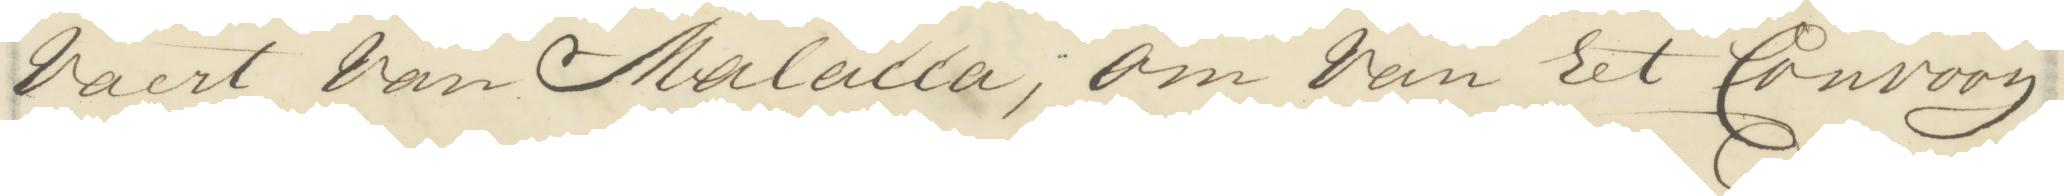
vaert van Malacca; om van het Convooij
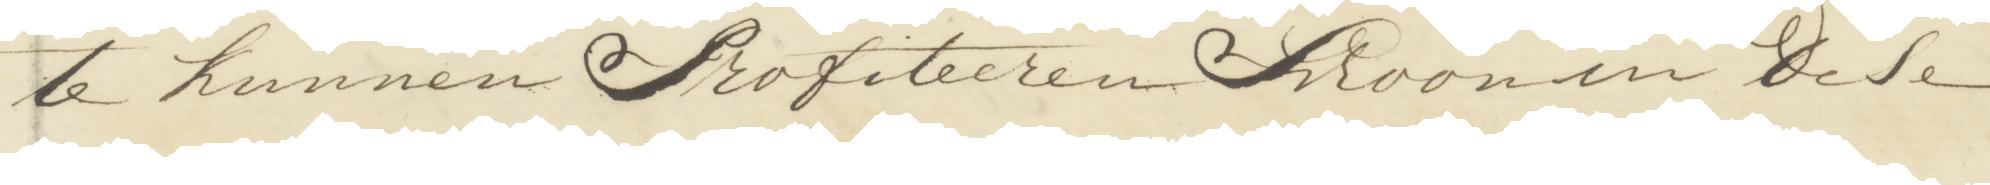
te kunnen Profiteeren Schoon in dese
